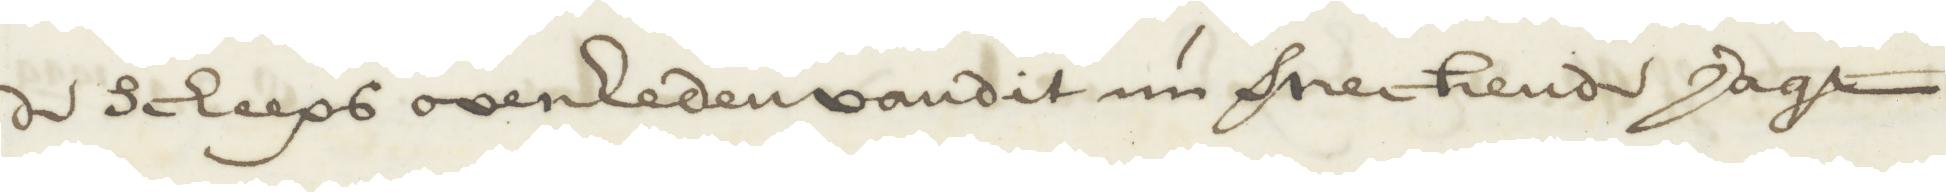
de scheeps overheden van dit nu vertreckende jagt
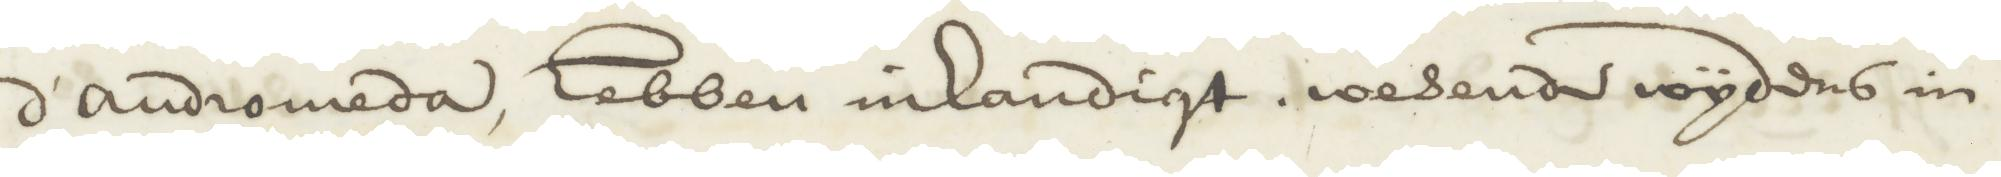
d’ andromeda, hebben inhandigt. wesende wijders in
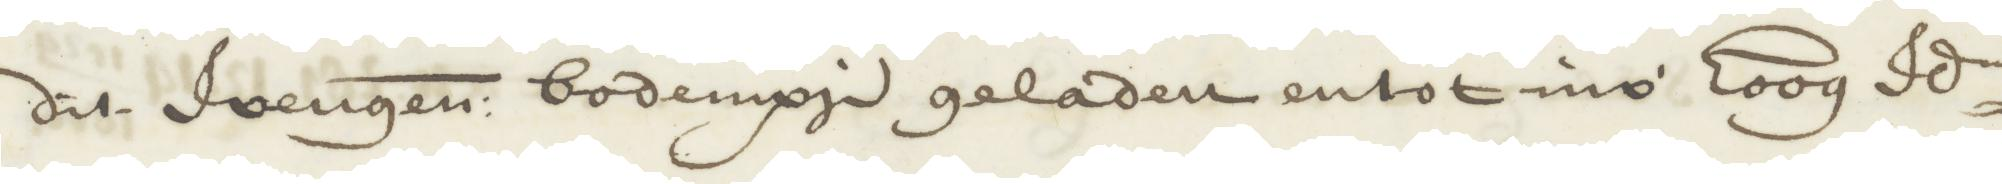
dit vervengen: bodempje geladen en tot uw hoog Ed=s
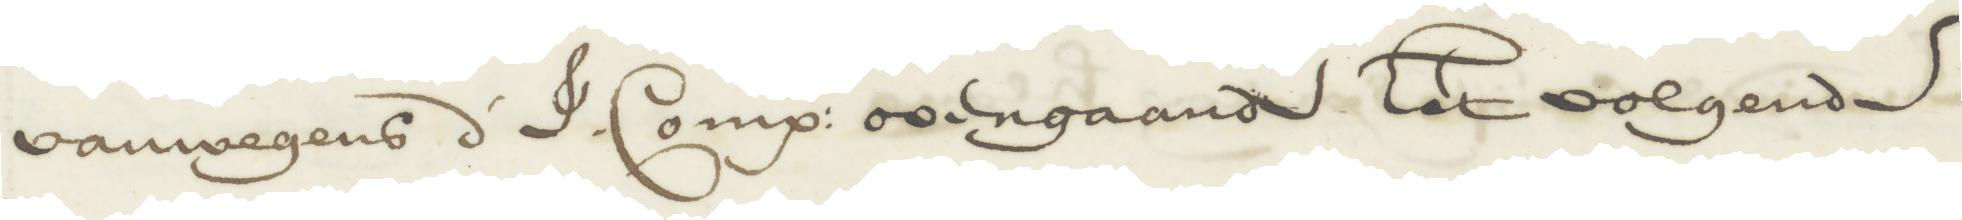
vanwegens d' E. Comp: overgaande het volgende
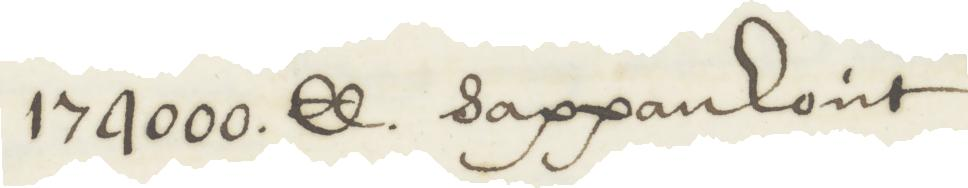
174000. lb. sappanhout
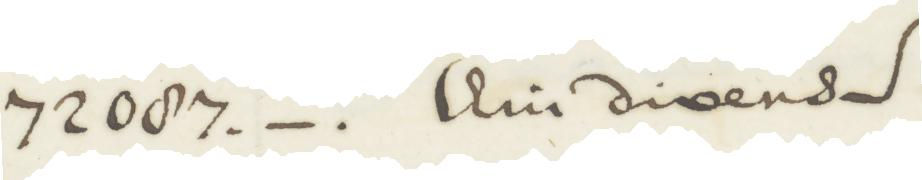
72087.—. thin diverse
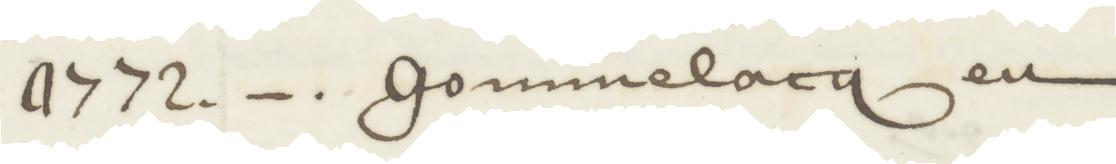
4772.—. gommelacq en
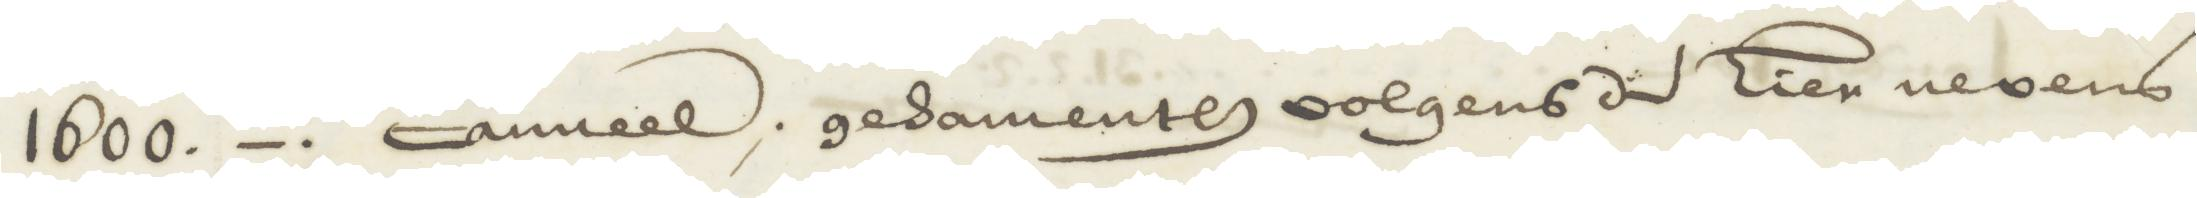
1600.—. canneel; gesamentlijk volgens de hier nevens
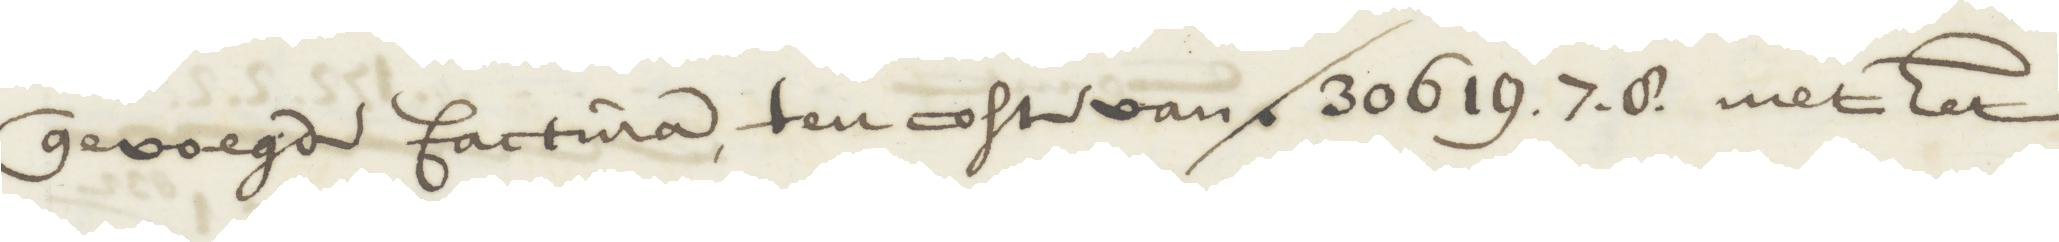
gevoegde factura, ten coste van ƒ 30619.7.8. met het
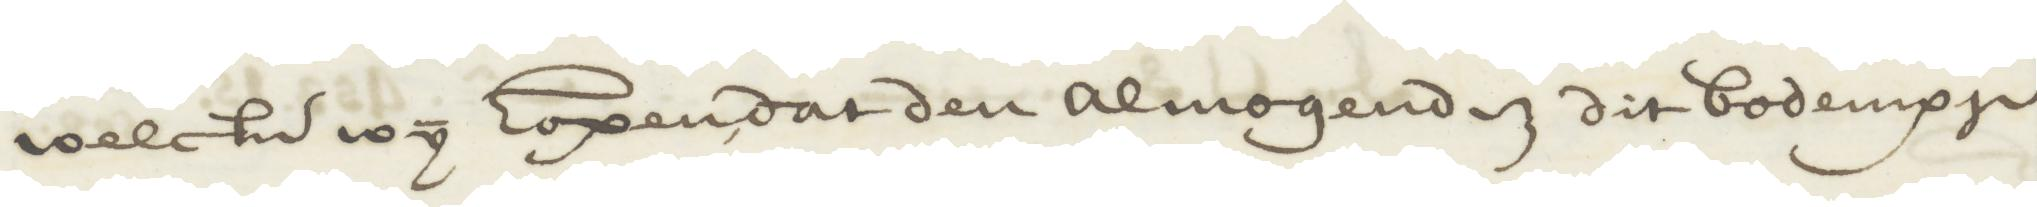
welcke wij hopen, dat den almogenden dit bodempje
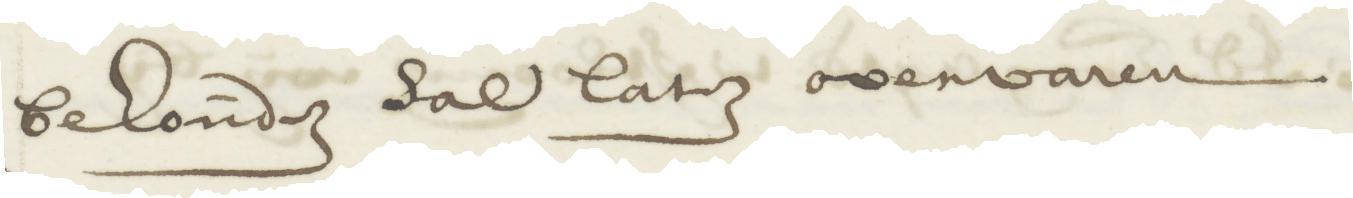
behouden sal laten overvaren.
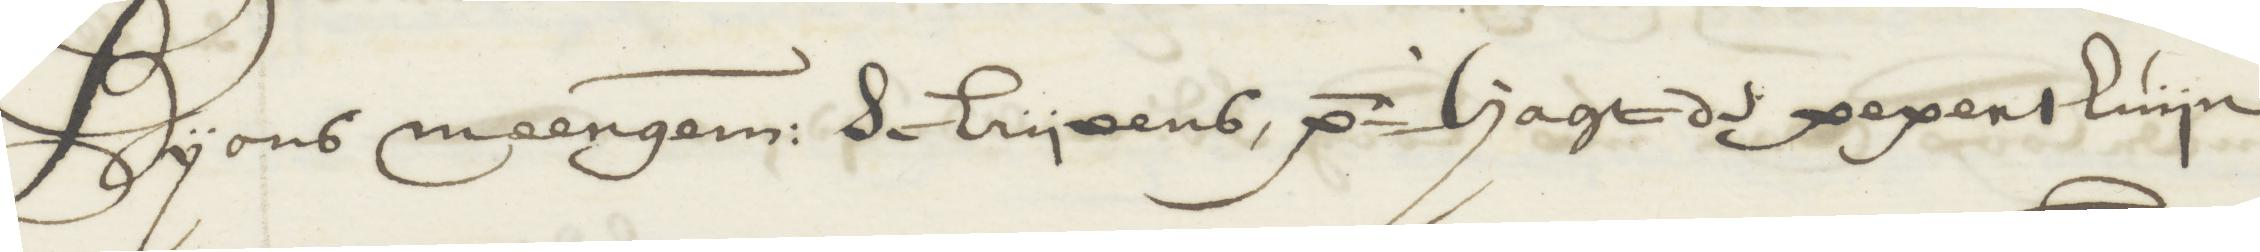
Bij ons meergem: schrijvens, p=r 't jagt de peperthuijn
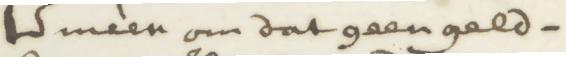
te meer om dat geen geld„
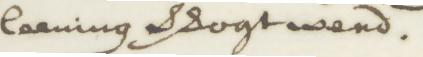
leening versogt werd.
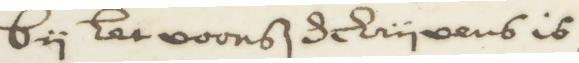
bij het voors schrijvens is
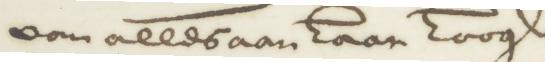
van alles aan haar hoogh
